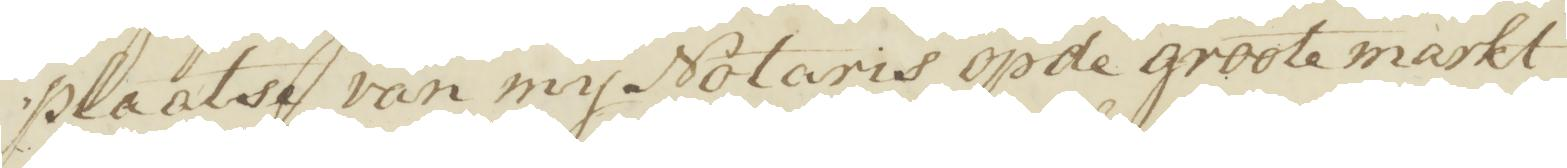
„plaatse van my Notaris op de groote markt
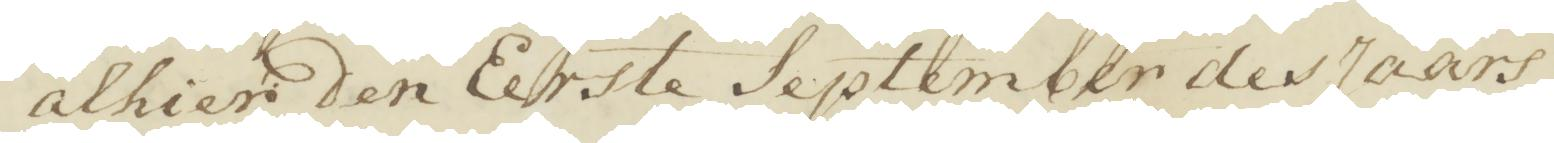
alhier den Eerste September des Jaars
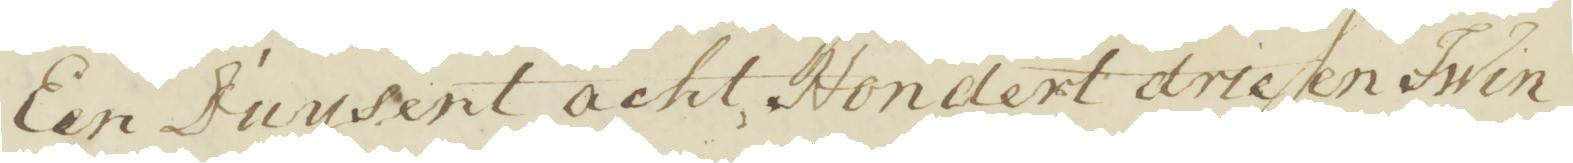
Een Duysent acht Hondert drie en Twin
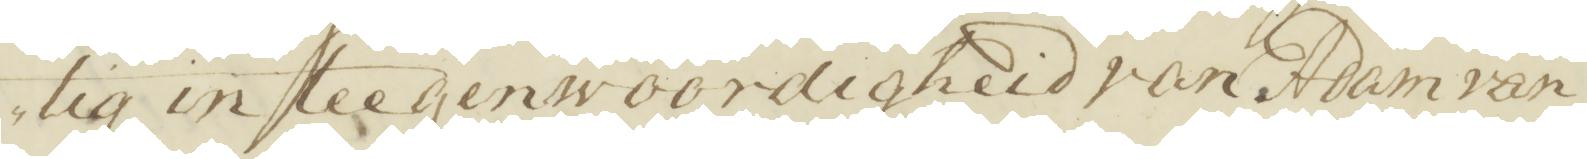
„tig, in teegenwoordigheid van Adam van
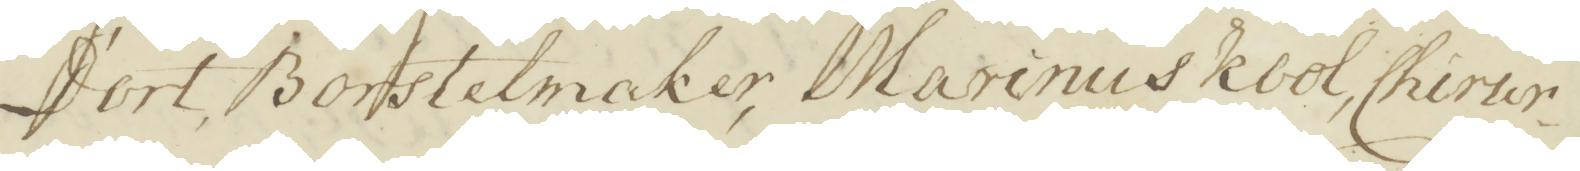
Dort, Borstelmaker, Marinus Kool, Chirur-
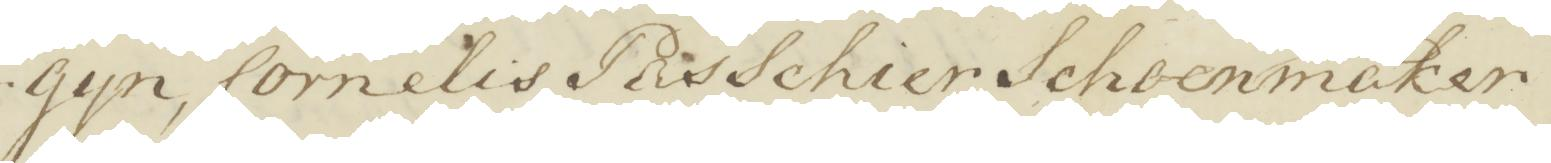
.gyn, Cornelis Passchier, Schoenmaker
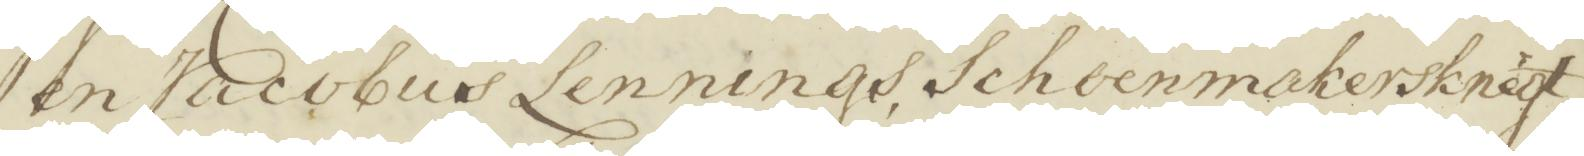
en Jacobus Lennings, Schoenmakersknegt,
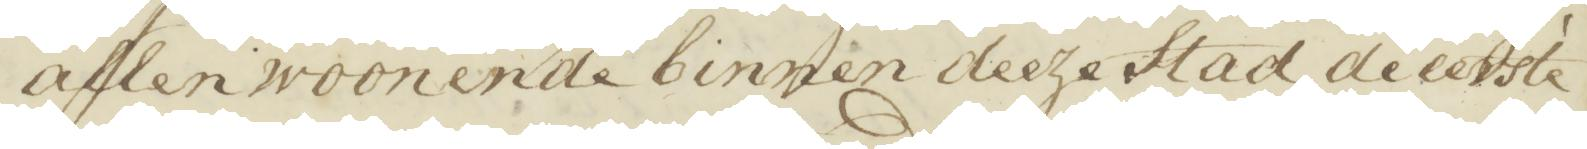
allen woonende binnen deeze stad, de eerste
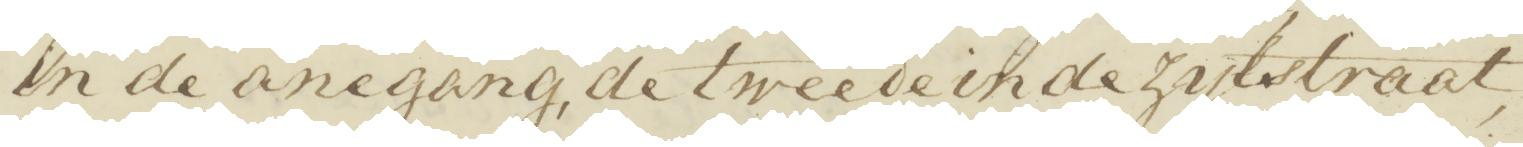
in de anegang, de tweede in de zylstraat,
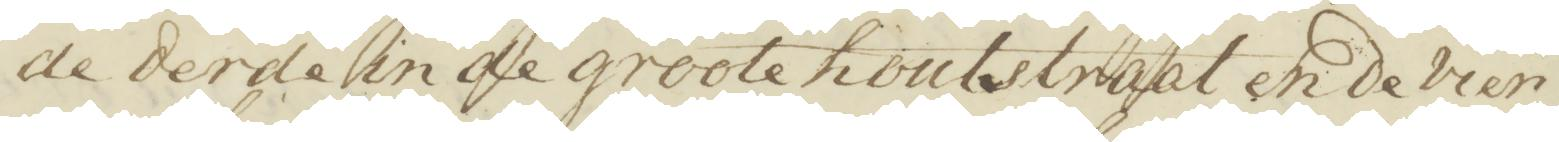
de derde in de groote houtstraat en de vier
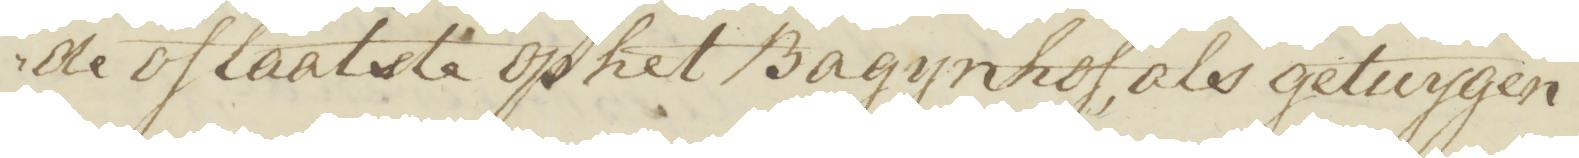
„de of laatste op het Bagynhof, als getuygen
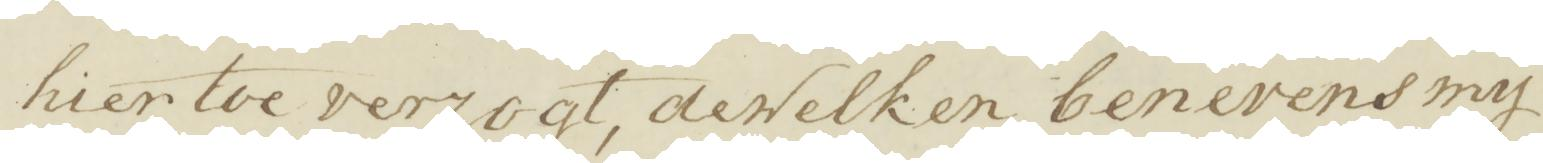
hier toe verzogt, dewelken benevens my
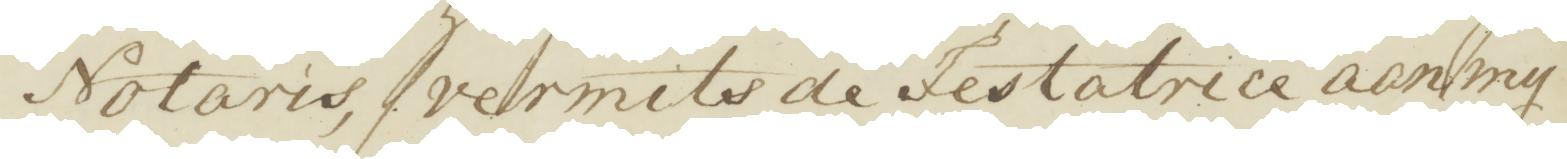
Notaris, /. vermits de Testatrice aan my
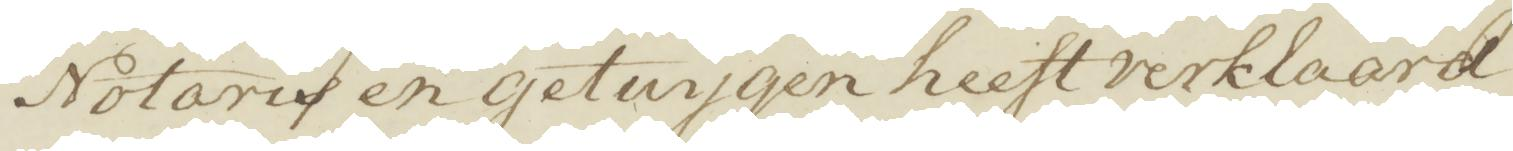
Notaris en getuygen heeft verklaard
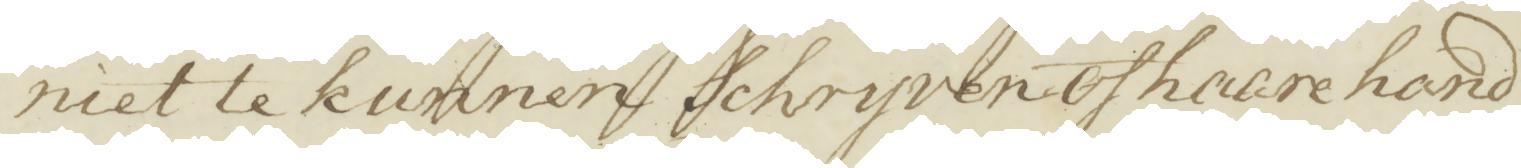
niet te kunnen schryven of haare hand
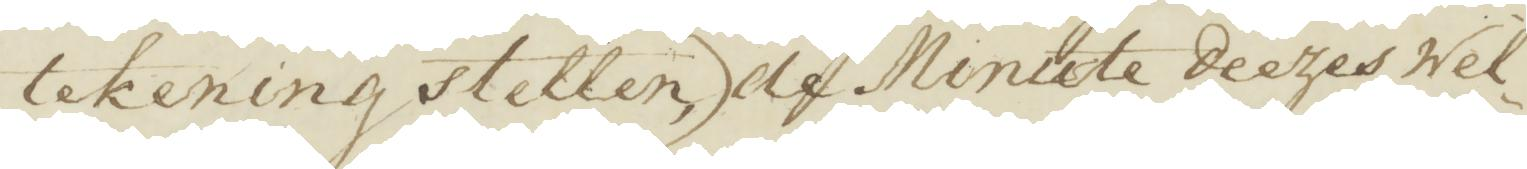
tekening stellen,) de Minute deezes wel„
